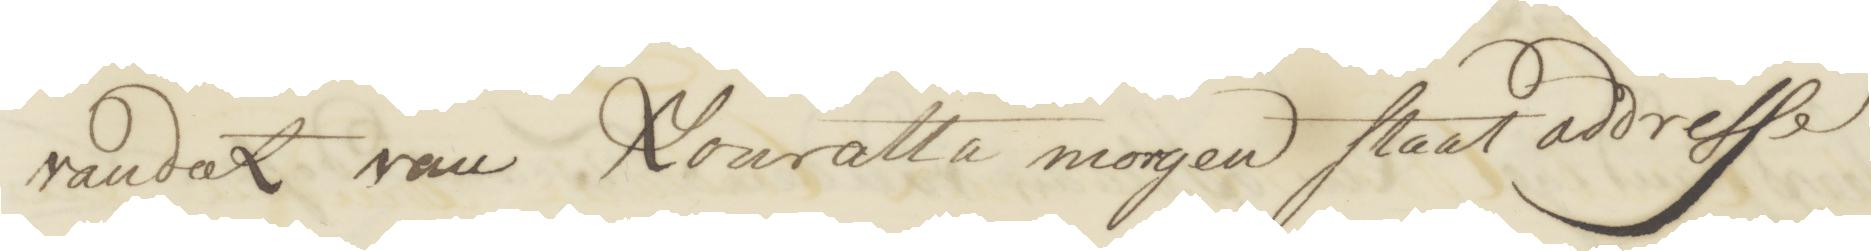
vandat van Zouratta morgen staat addresse
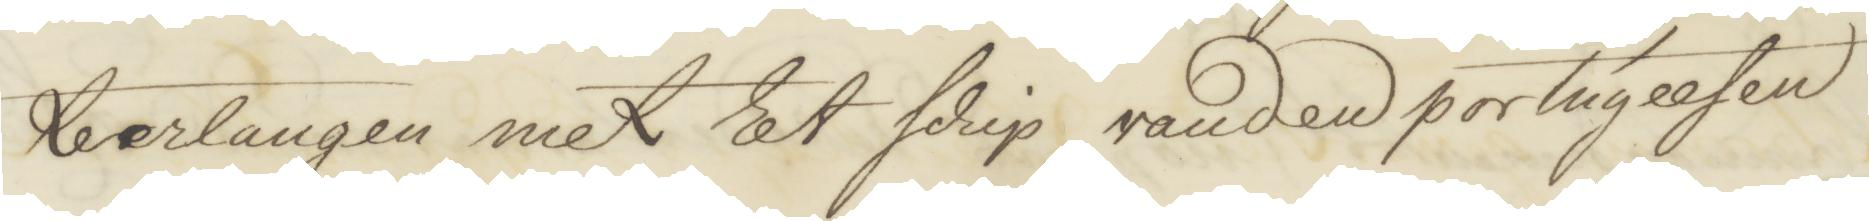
teerlangen met het schip vanden portugeesen
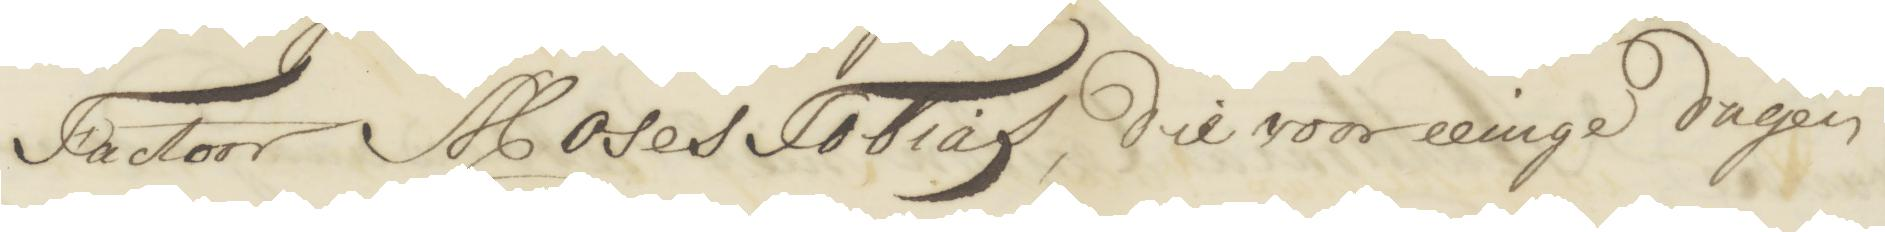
Factoor Moses Tobias, die voor eenige dagen
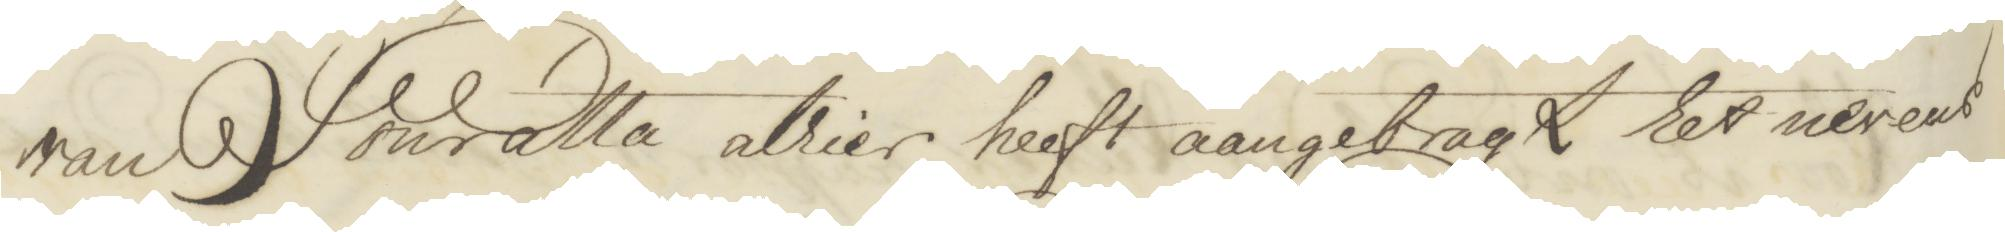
van Souratta alhier heeft aangebragt het nevens
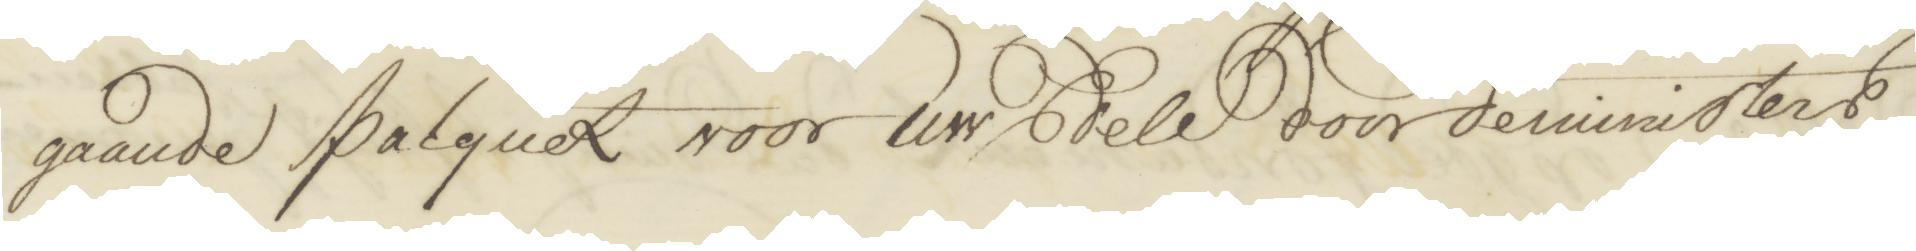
gaande pacquet voor uw Edele door de ministers
